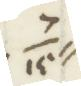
7/15„
